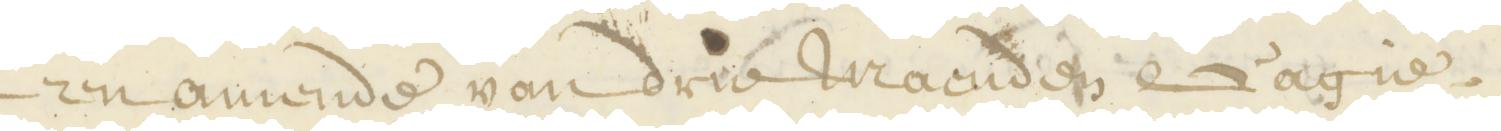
een amende van drie Maenden Gagie
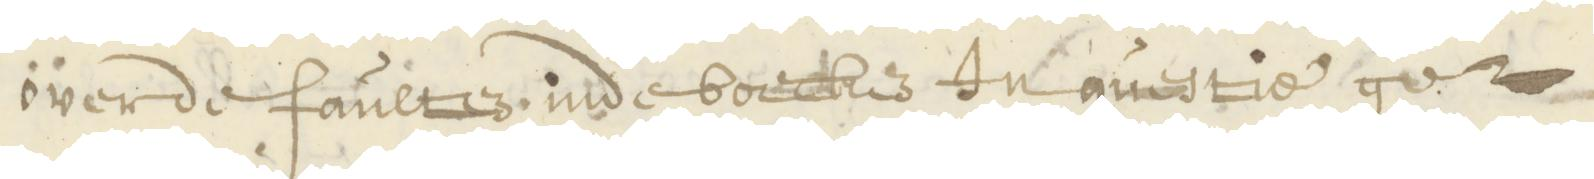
over de faulten inde boecken In questie ge=
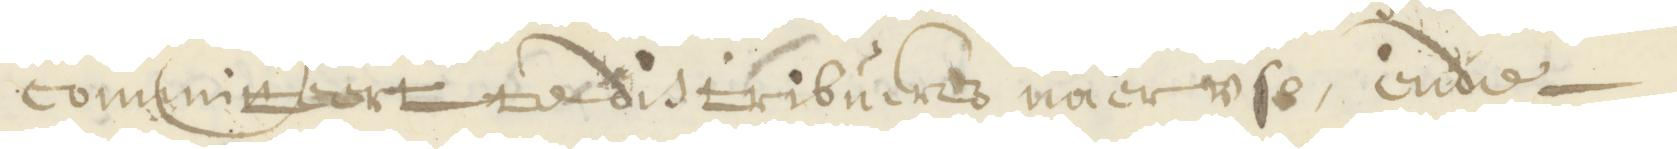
committeert te distribueren naer uso, ende —
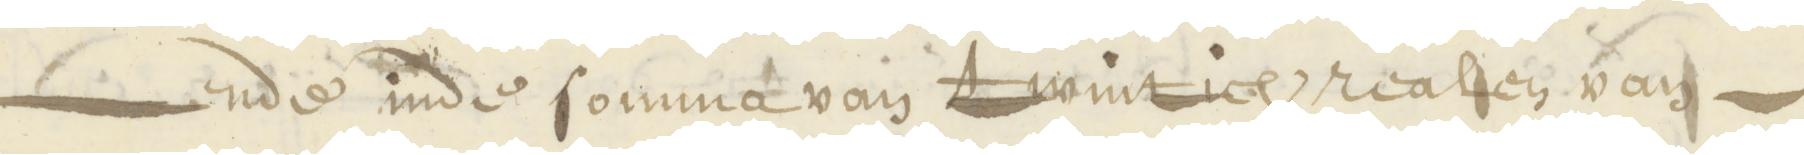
ende inde somma van twintig realen van —
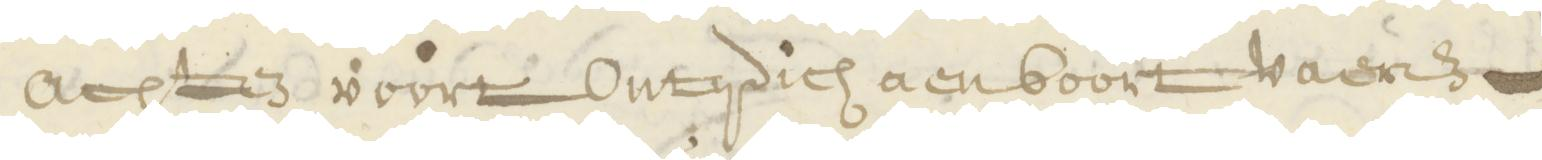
agten voort Ontydich aen boort vaeren —
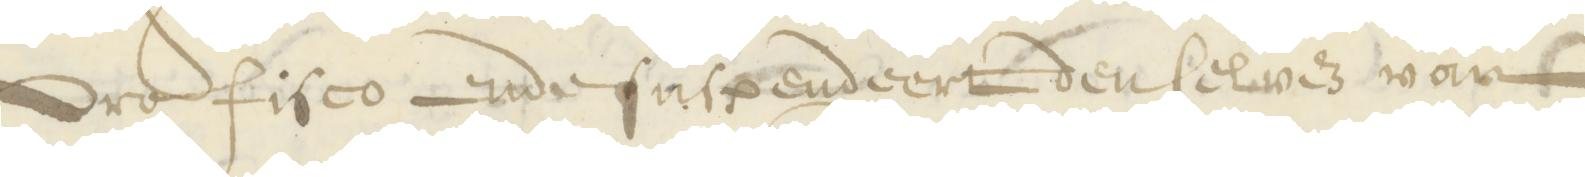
pro fisco ende suspendeert den selven van
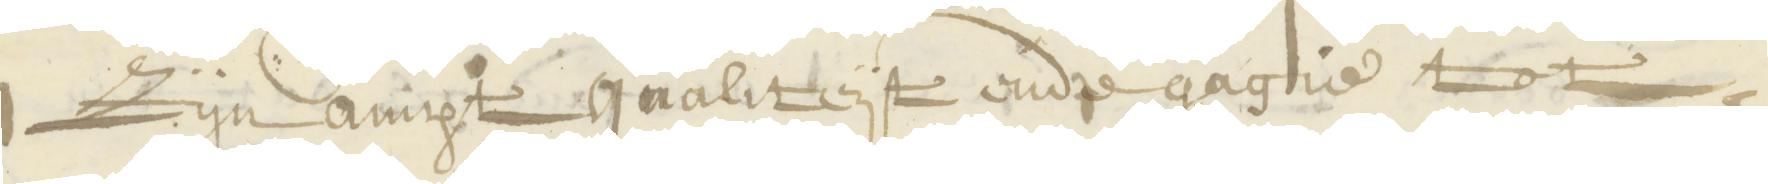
Zijn ampt qualiteijt ende gagie tot —
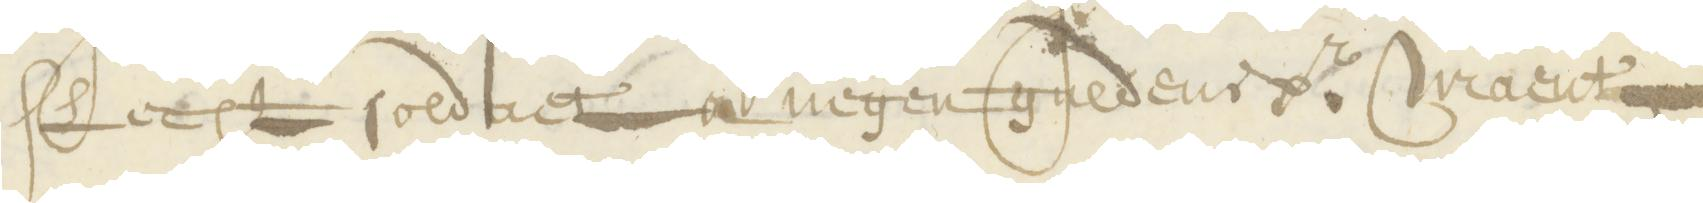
Slecht soldaet a negen guldens p„r Maent
